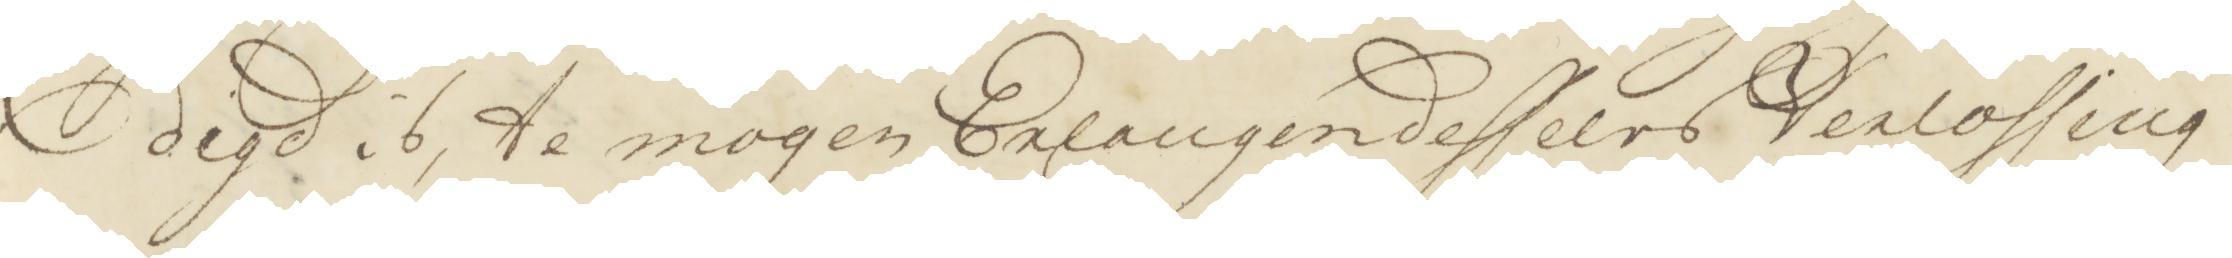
digd is, te mogen Erlangen desselvs verlossing
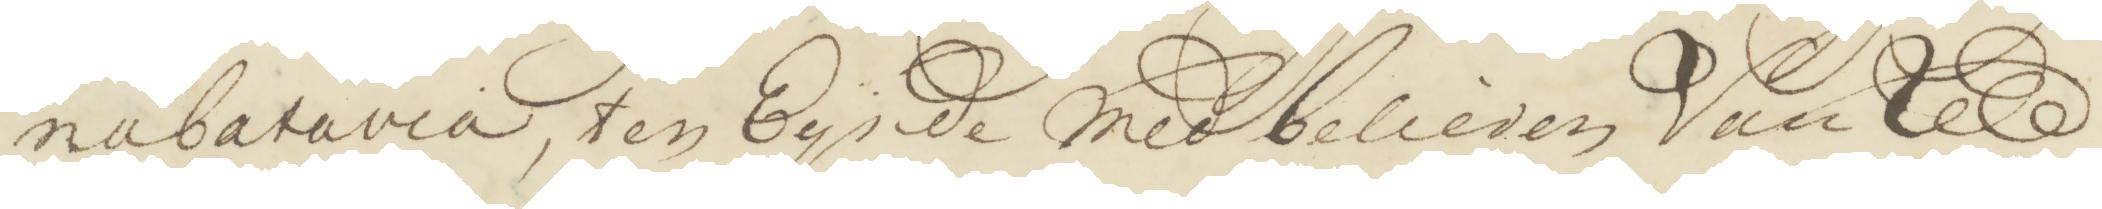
na batavia, ten Eijnde med believen van UEd
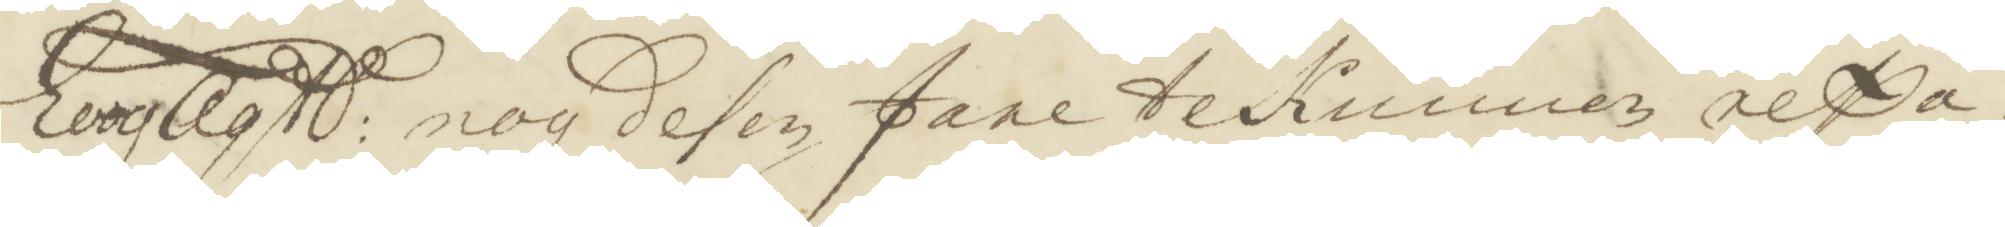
hoog Agtb: nog desen Jare te kunnen repa
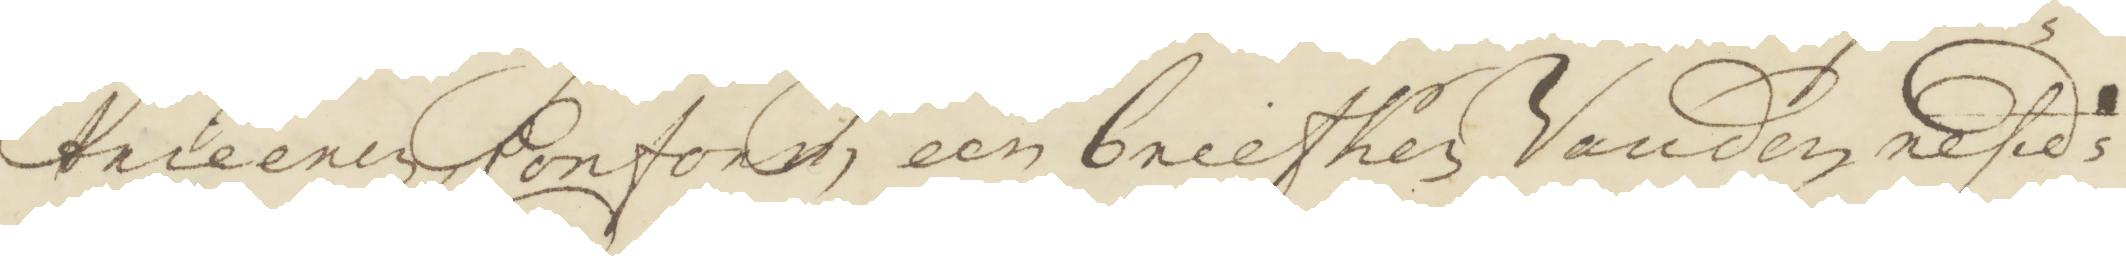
trieeren, Conform een briefken van den resid=t
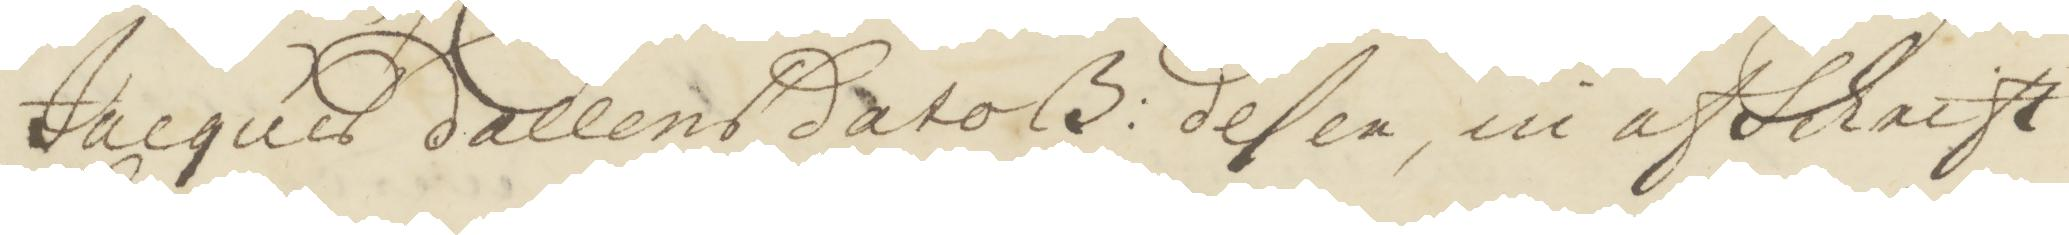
Iacques dallens dato 3: deser, in afschrift
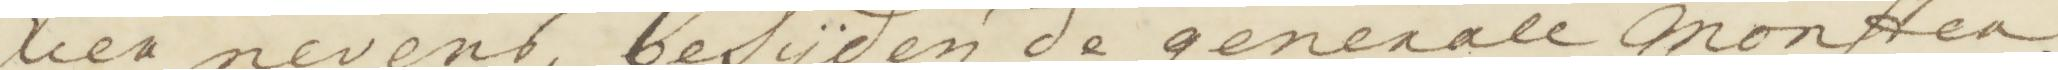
hier nevens, besijden de generale monster
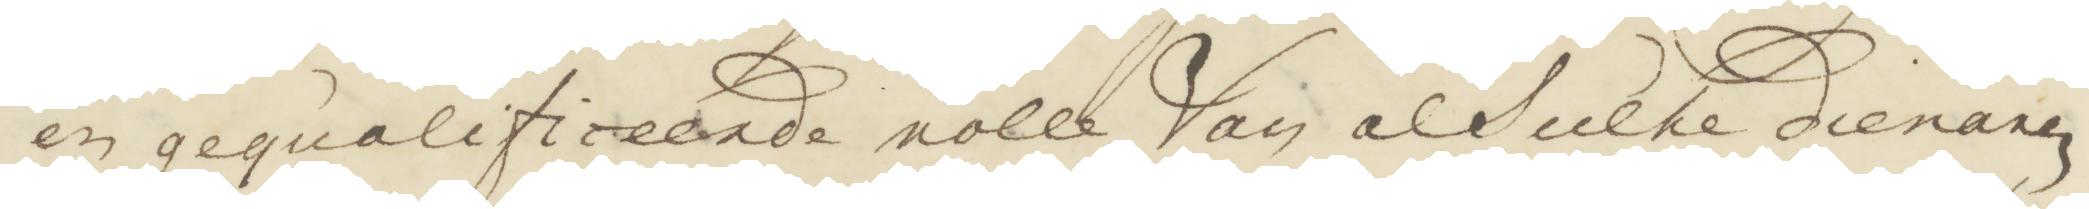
en gequalificeerde rolle van alsulke dienaren
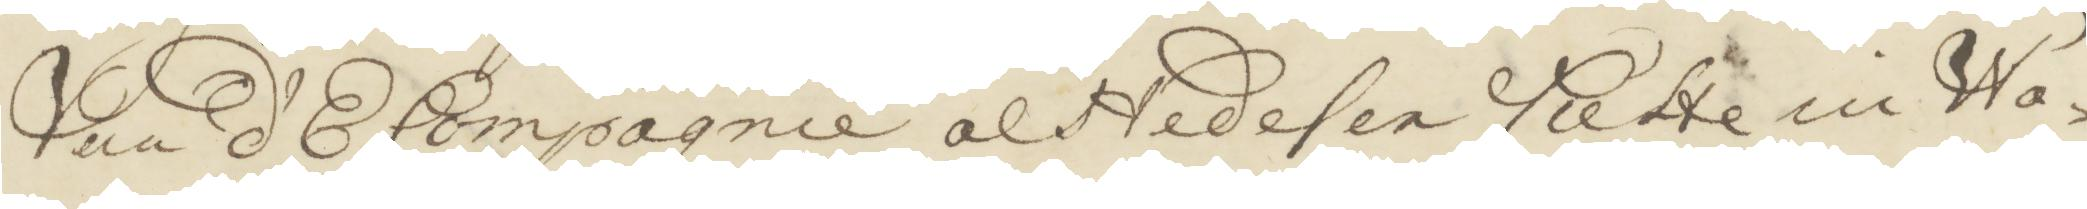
Van d’E Compagnie als te deser Custe in wa
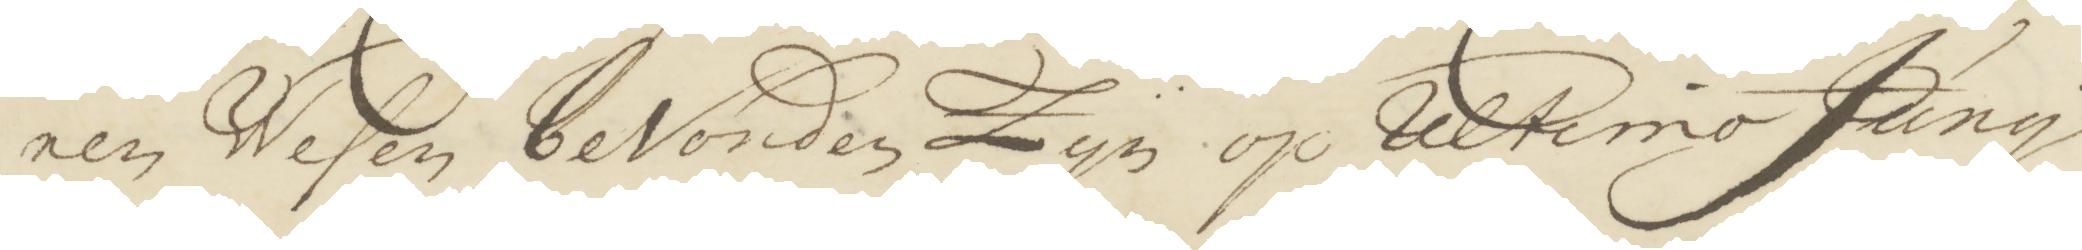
ren wesen bevonden zijn op ultimo Junij
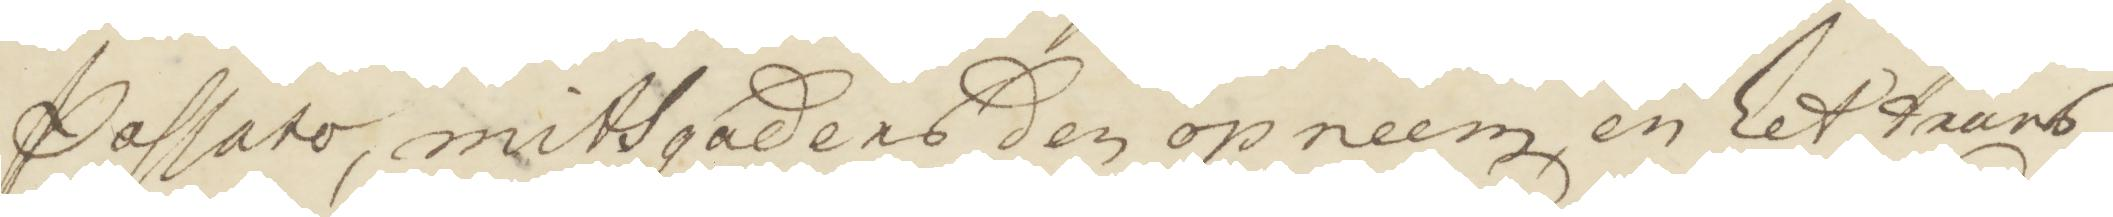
Passato, mitsgaders den op neem, en het trans
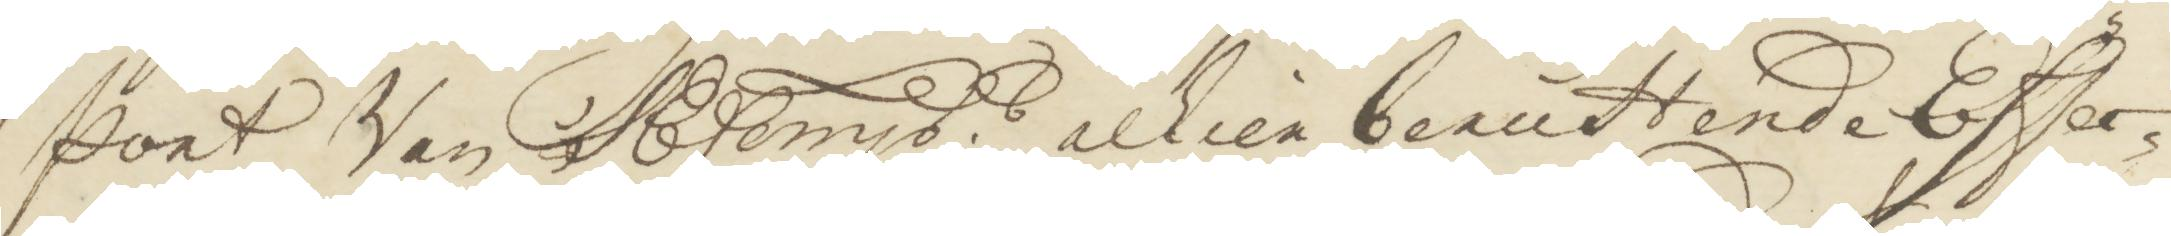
Port van 's E Comp:s alhier berustende Effec„
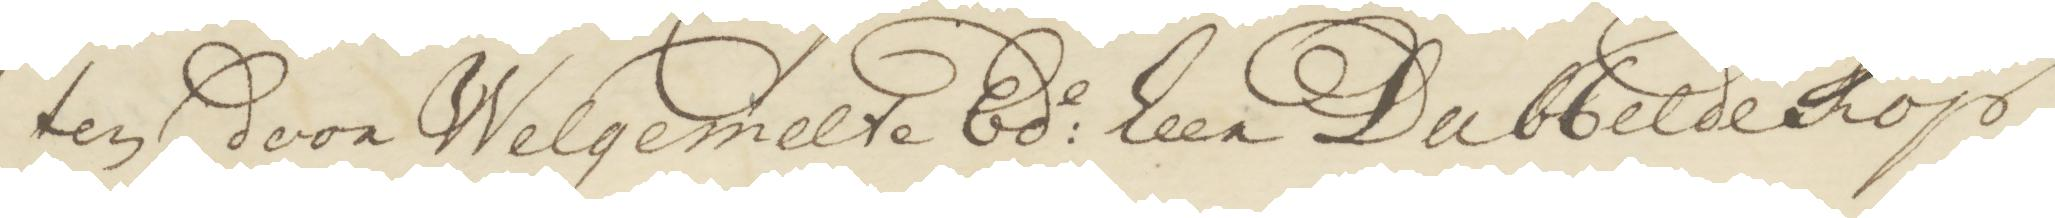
ten, door welgemelte Ed:e heer Dubbeldekop
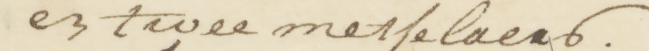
en twee metselaers.
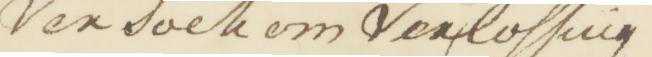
versoek om verlossing
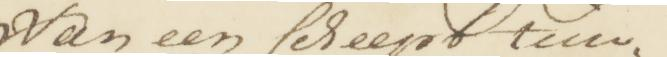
van een scheeps tim„
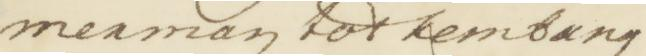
merman tot rembang
